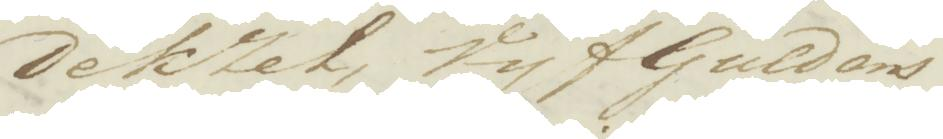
dekzel, Vyf Guldens
